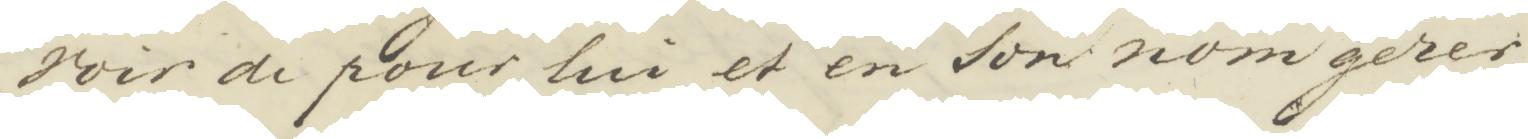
=voir de pour lui et en son nom gerer
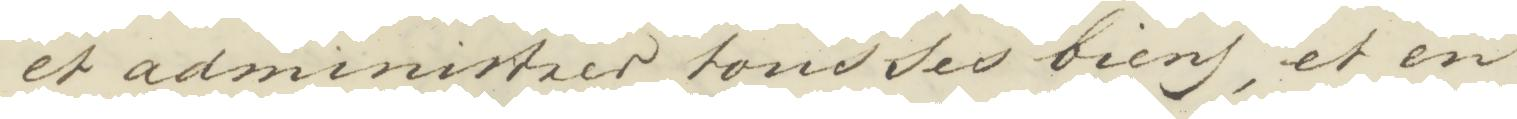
et administrer tous ses biens, et en
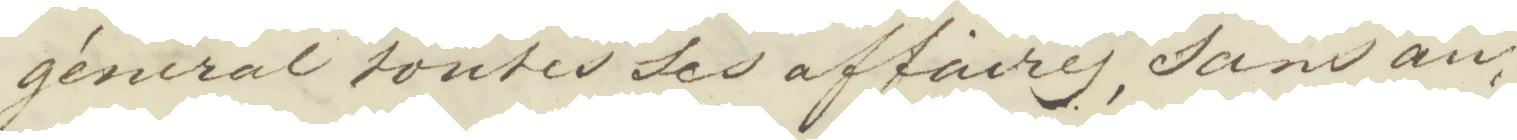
géneral toutes ses affaires, sans au„
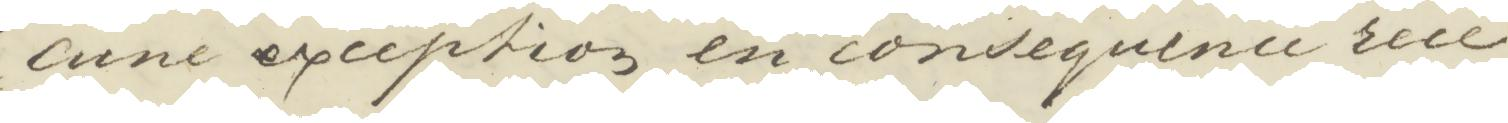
=cune exception, en consequence rece
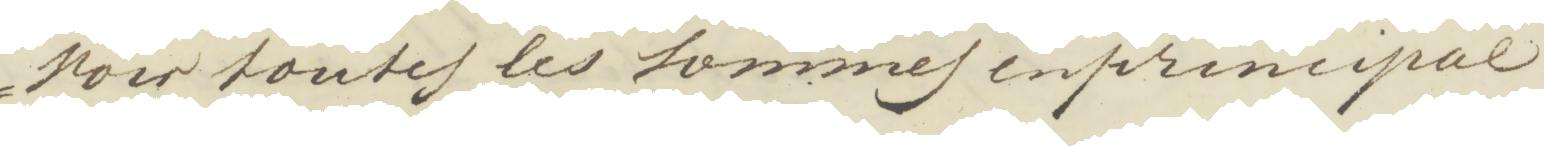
=voir toutes les sommes en principal
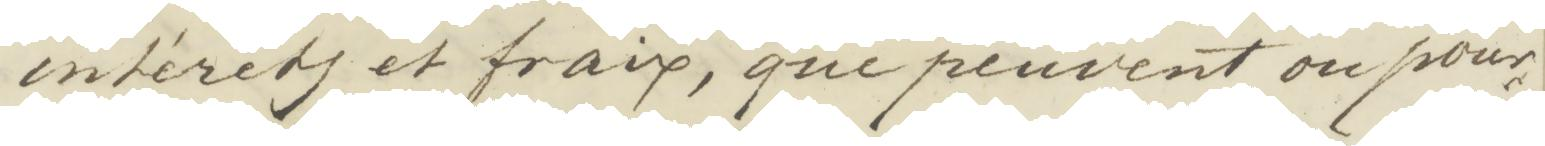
intérets et fraix, que peuvent ou pour„
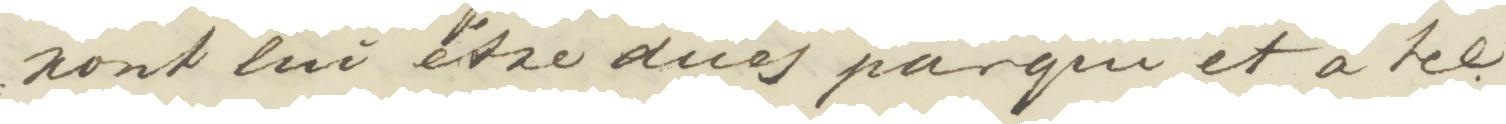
ront lui être dues parqui et a tel
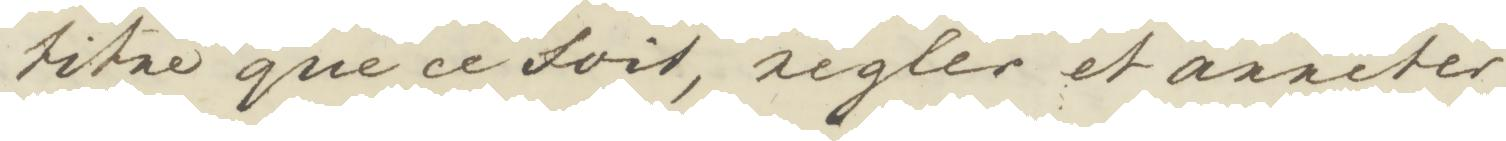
titre que ce sois, rêgler et arrêter
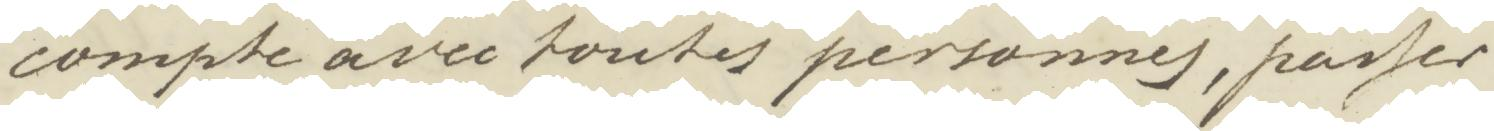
compte avec toutes personnes, passer
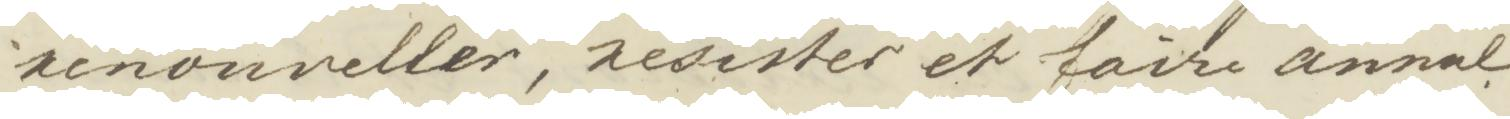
renouveller, resister et faire annul;
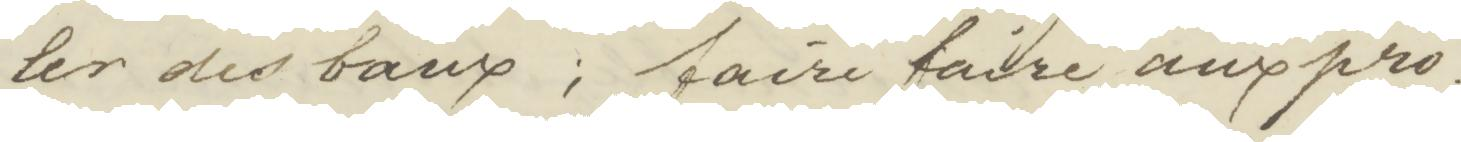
ler des baux; faire faire aux pro
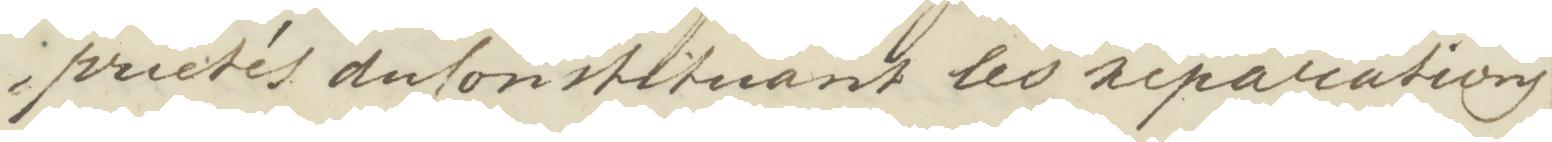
„prietés du Constituant les reparations
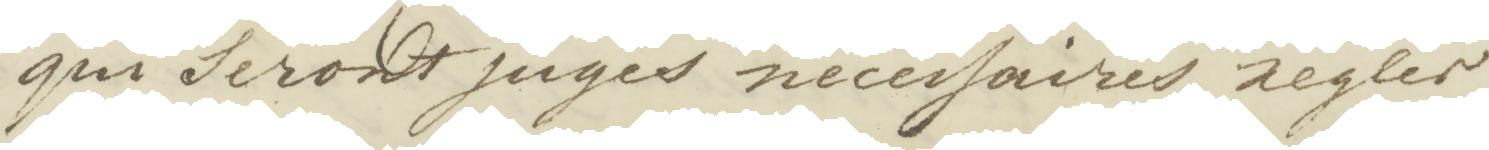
qui seront jugés necessaires, rêgler
